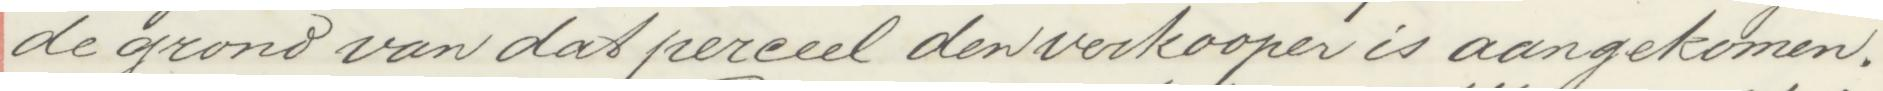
de grond van dat perceel den verkooper is aangekomen,
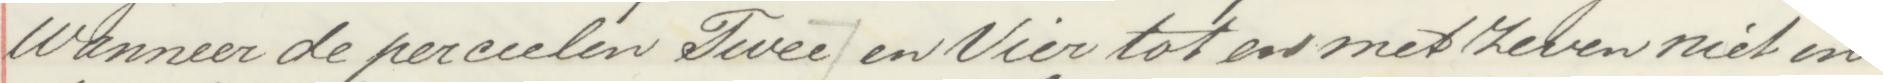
Wanneer de perceelen Twee] en Vier tot en met zeven niet in
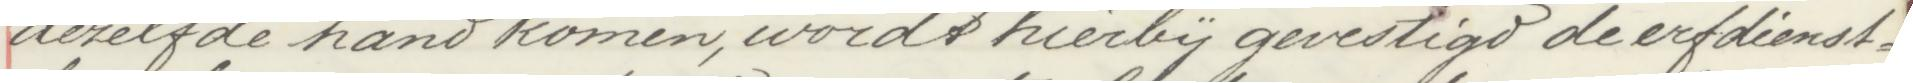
dezelfde hand komen, wordt hierbij gevestigd de erfdienst=
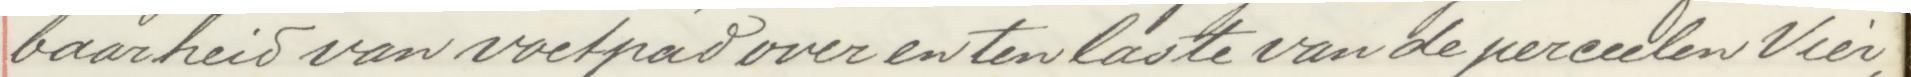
baarheid van voetpad over en ten laste van de perceelen vier,
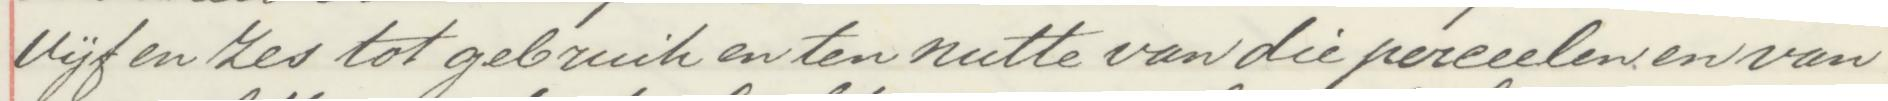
vijf en zes tot gebruik en ten nutte van die perceelen en van
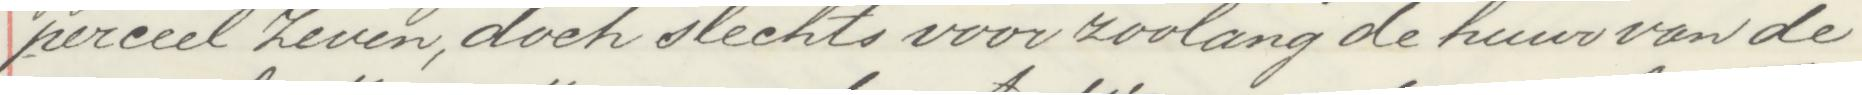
perceel zeven, doch slechts voor zoolang de huur van de
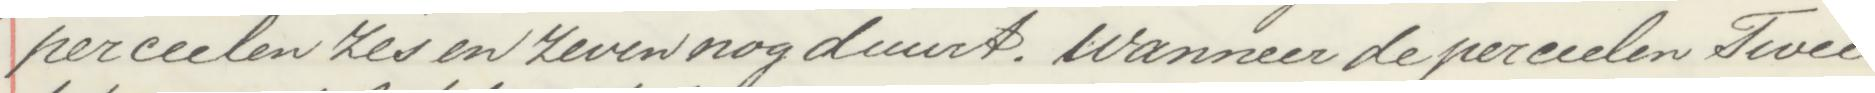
perceelen zes en zeven nog duurt. Wanneer de perceelen Twee
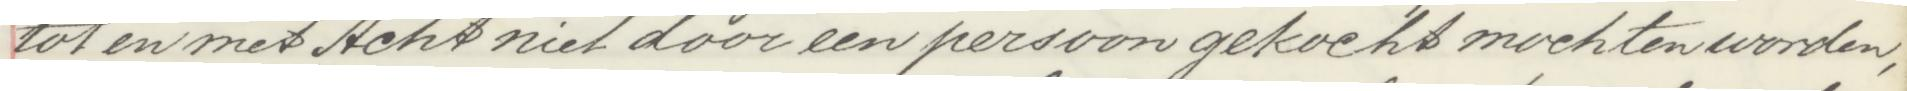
tot en met Acht niet door een persoon gekocht mochten worden,
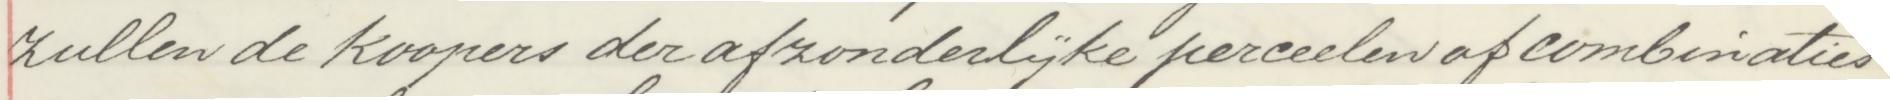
zullen de koopers der afzonderlijke perceelen of combinaties
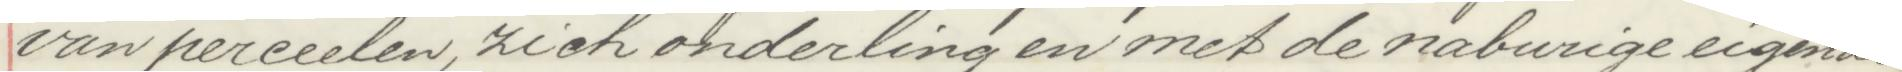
van perceelen, zich onderling en met de naburige eigena-
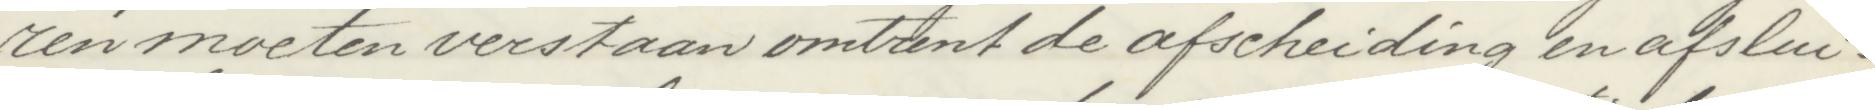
ren moeten verstaan omtrent de afscheiding en afslui-
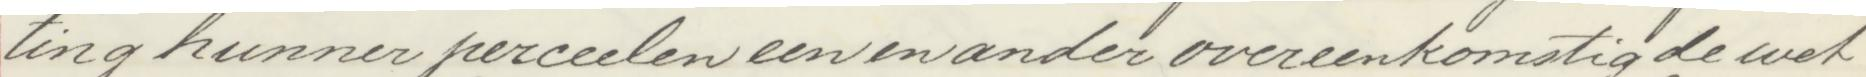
ling hunner perceelen een in ander overeenkomstigde wet
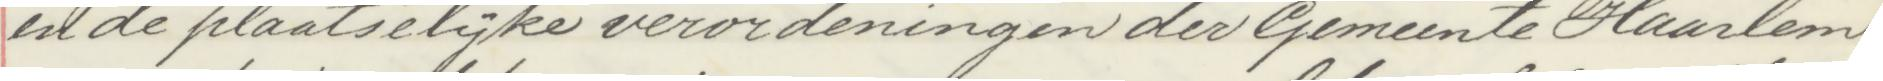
en de plaatselijke verordeningen der Gemeente Haarlem
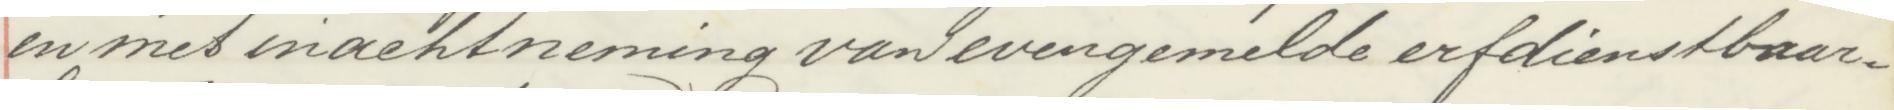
en met in achtneming van evengemelde erfdienstbaar„
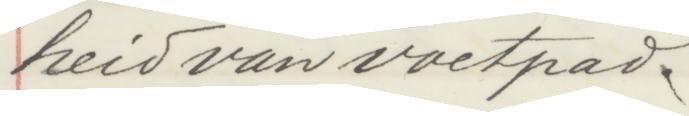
heid van voetpad.
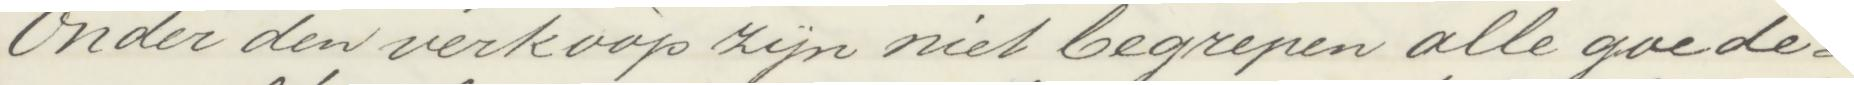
Onder den verkoop zijn niet begrepen alle goede=
